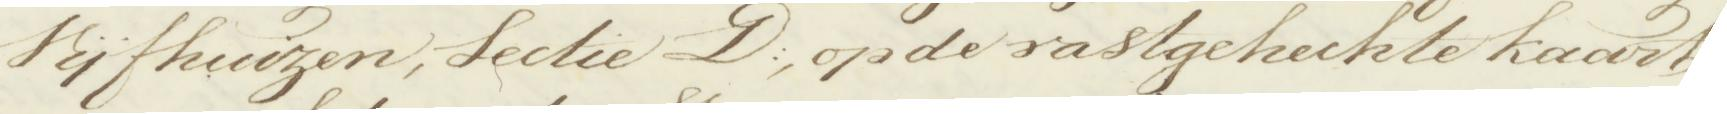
Vijfhuizen, sectie D:, op de vastgehechte kaart
